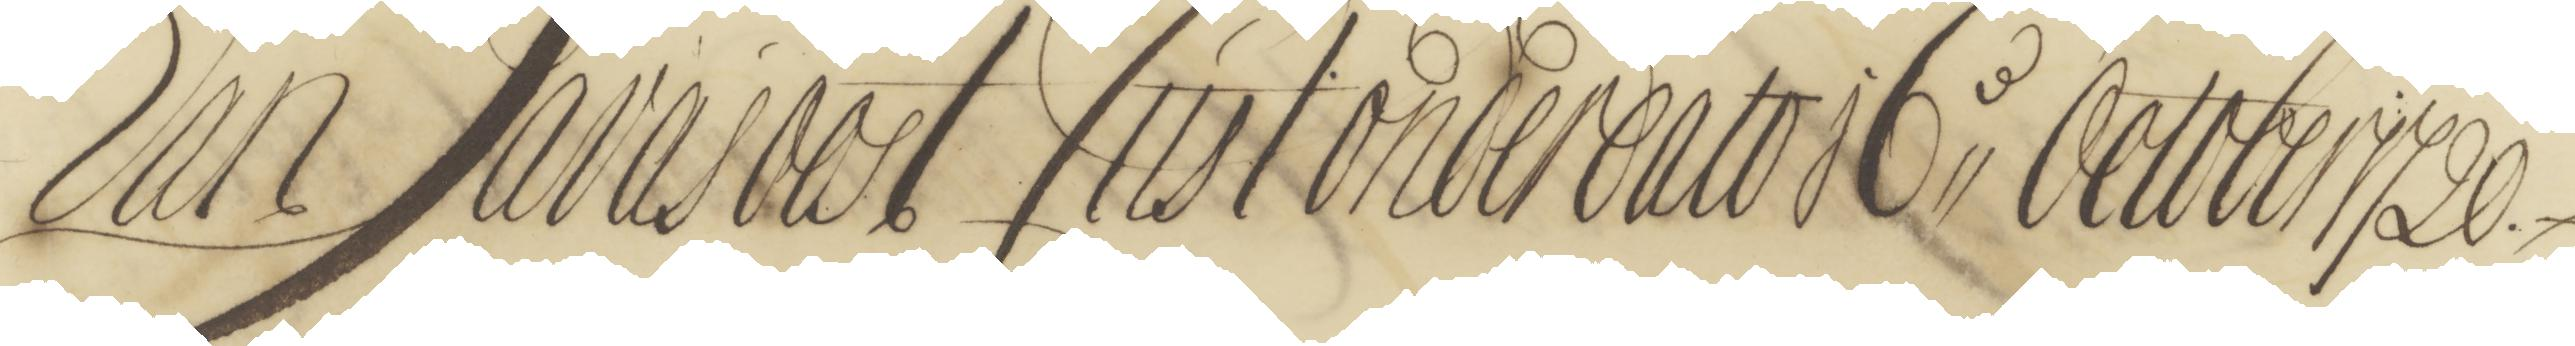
Van Java's oost Cust onder dato 16„e October 1720. —
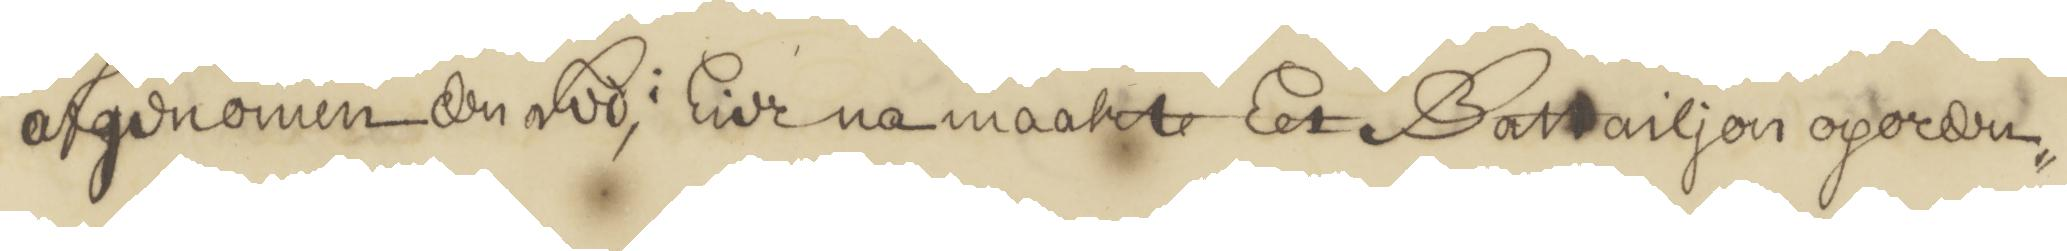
afgenomen den Eed; hier na maakte het Battailjon oporden„
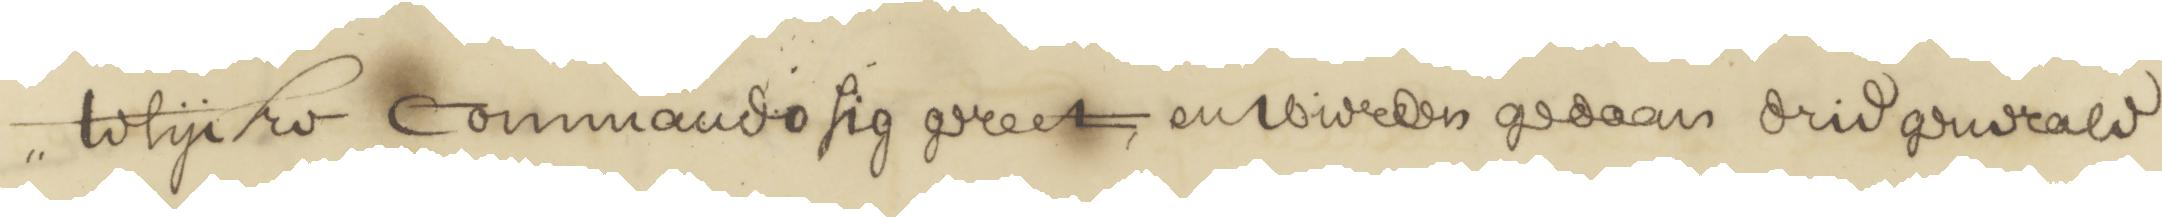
„ telijcke Commando sig gereet, en wierden gedaan drie generale
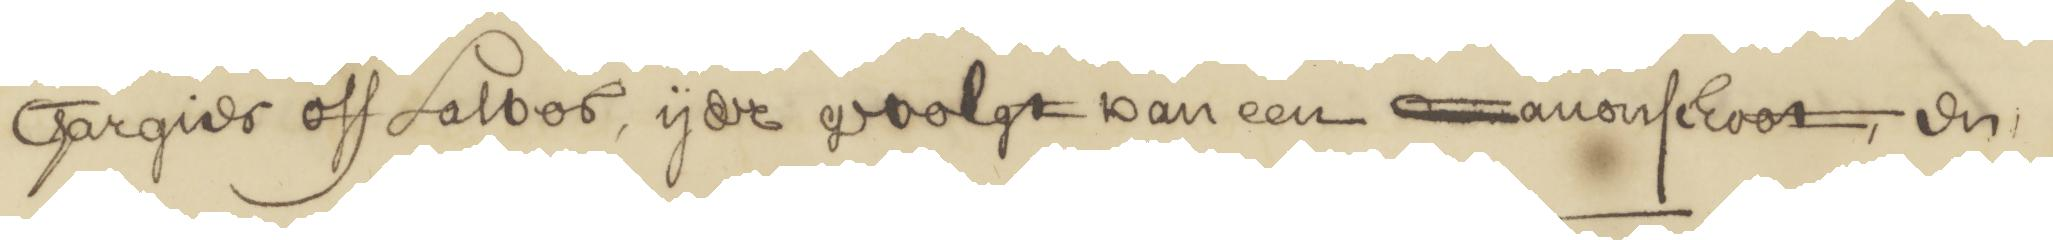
Chargies off salvos, ijder gevolgt van een Canonschoot, en
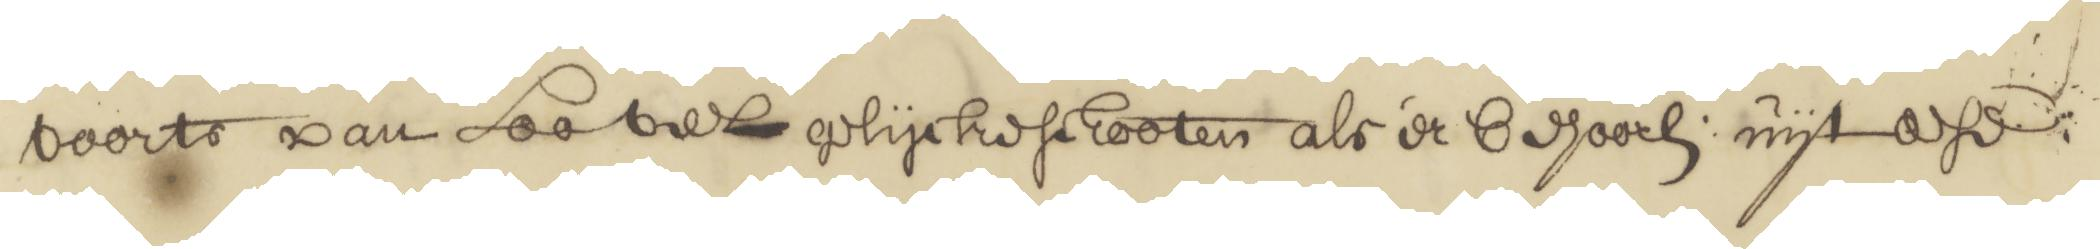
voorts van soo veel gelijcke schooten als 'er behoorlijk: uijt dese:
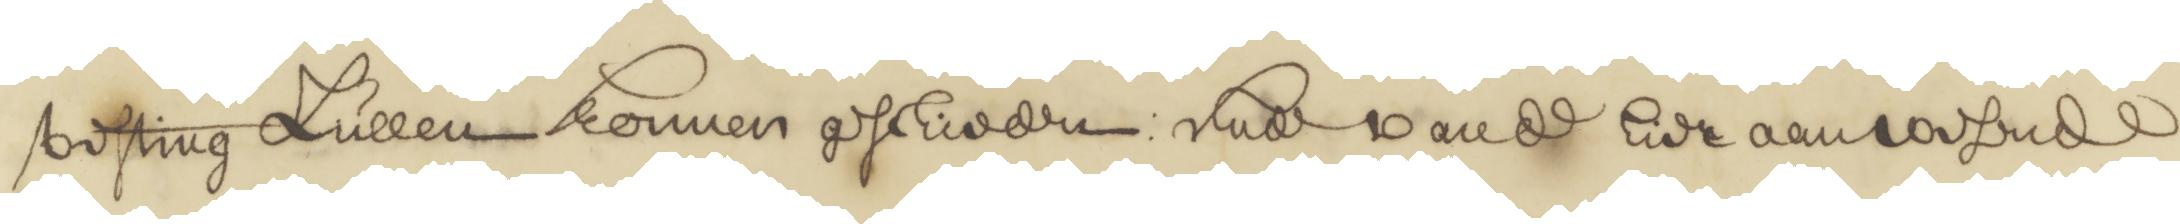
vesting Zullen konnen geschieden: Ende van de hier aanwesende
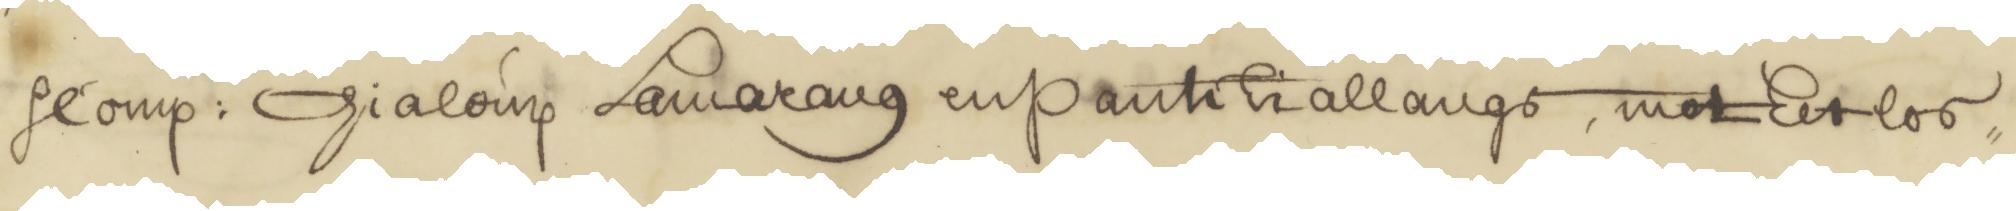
scomp: Chialoup samarang en pantchiallangs, met het los„
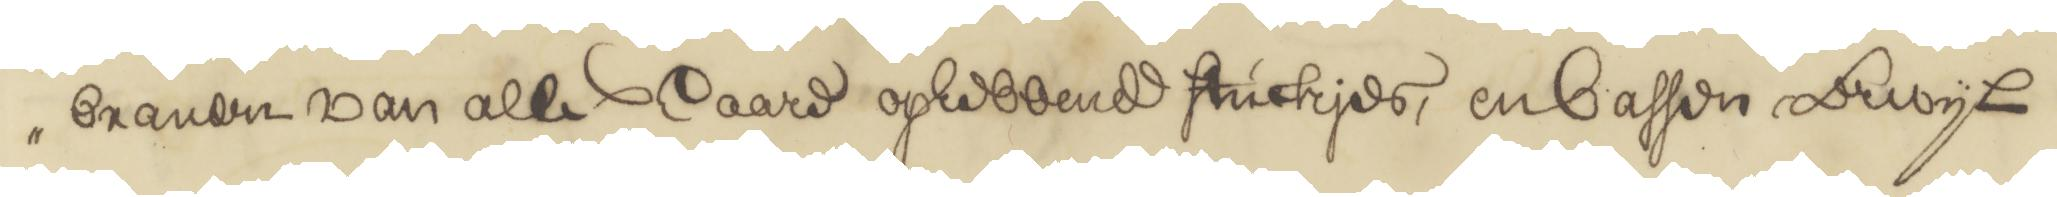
„ branden van alle Haare ophebbende stuckjes, en bassen terwijl
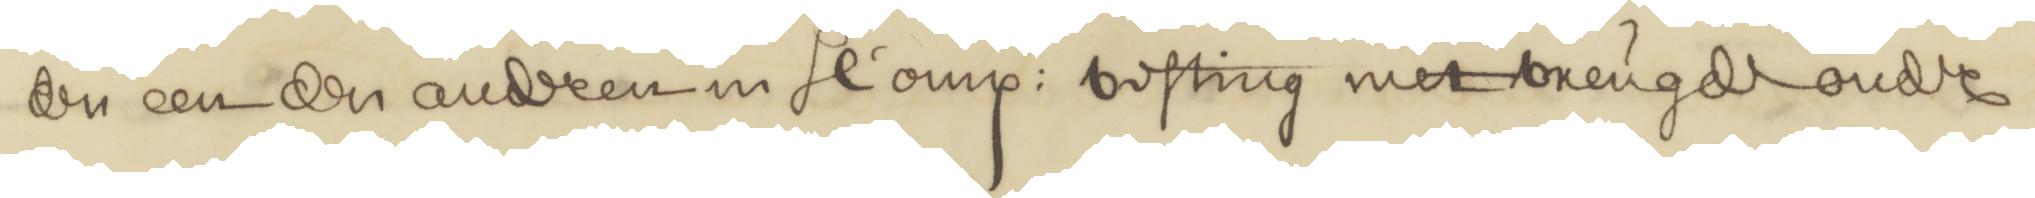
den een den anderen in 'scomp: vesting met vreugde onder
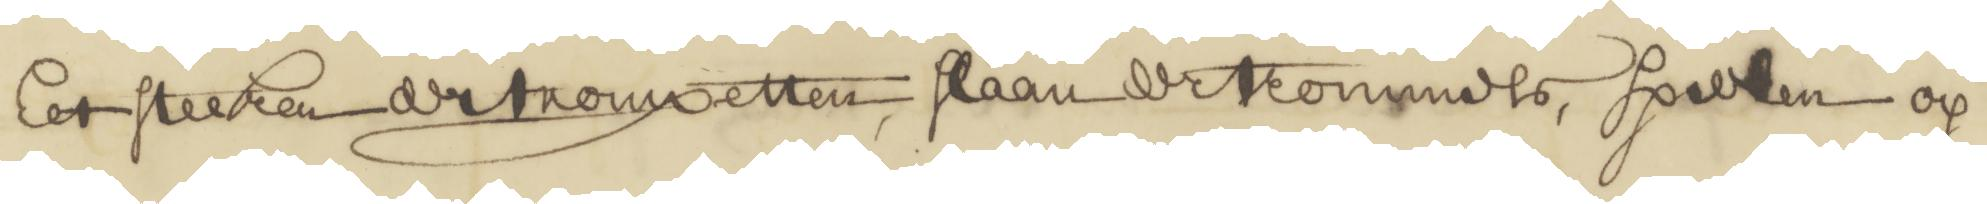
het steeken der trompetten, slaan der trommels, speelen op
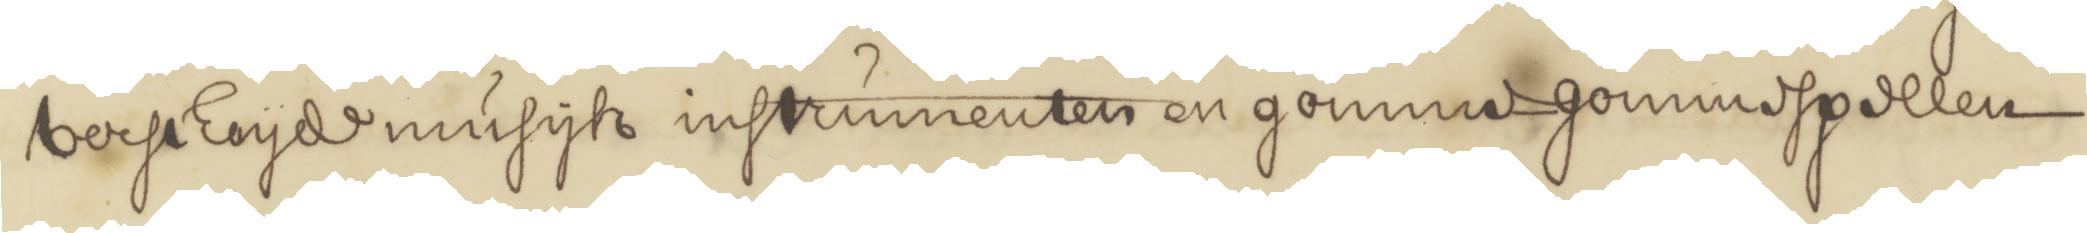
verscheijde musijk instrumenten en gomme-gommespellen
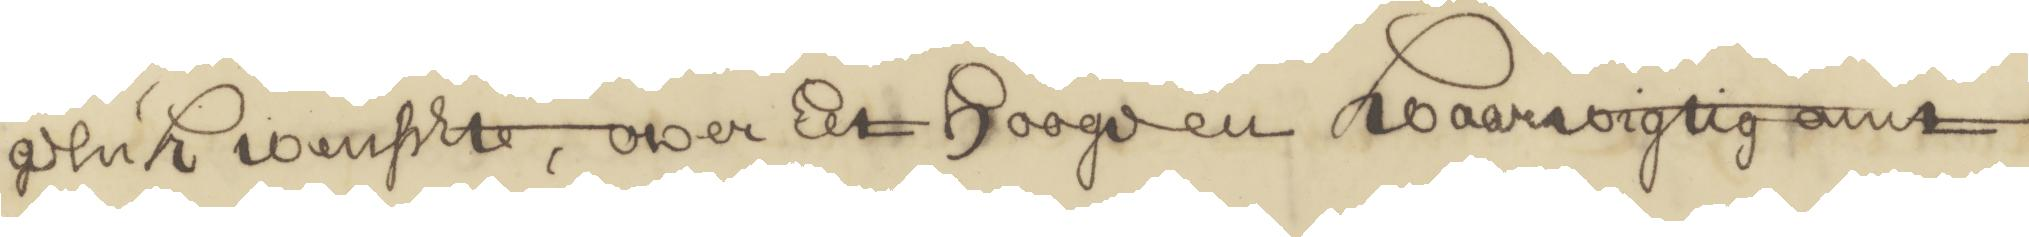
geluk wenschte, over het Hooge en swaarwigtig amt
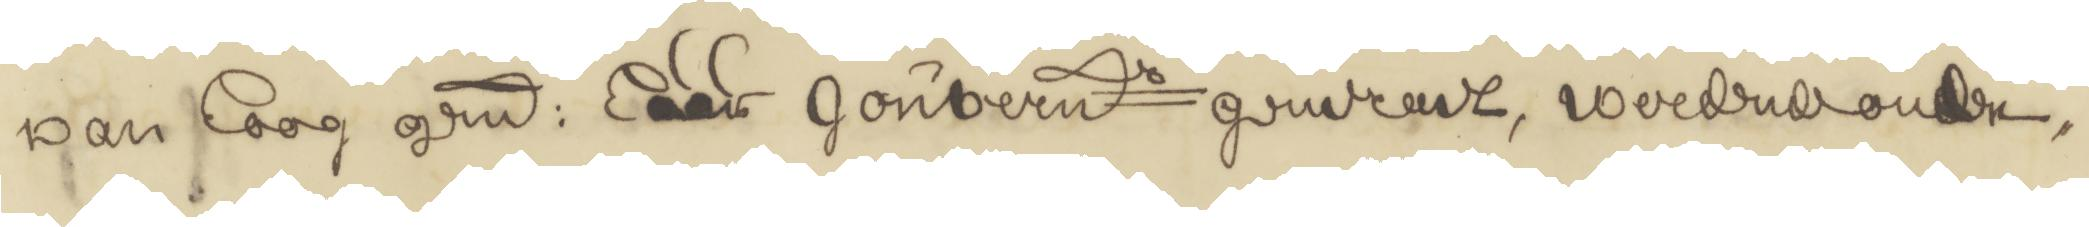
van hoog gem: heer gouvern=r generael, werdende onder„
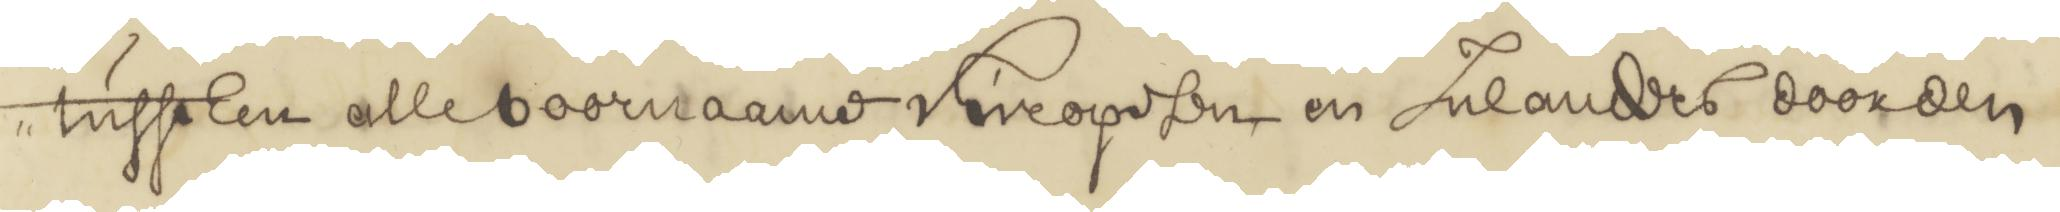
„tusschen alle voornaame Europesen en Inlanders door den
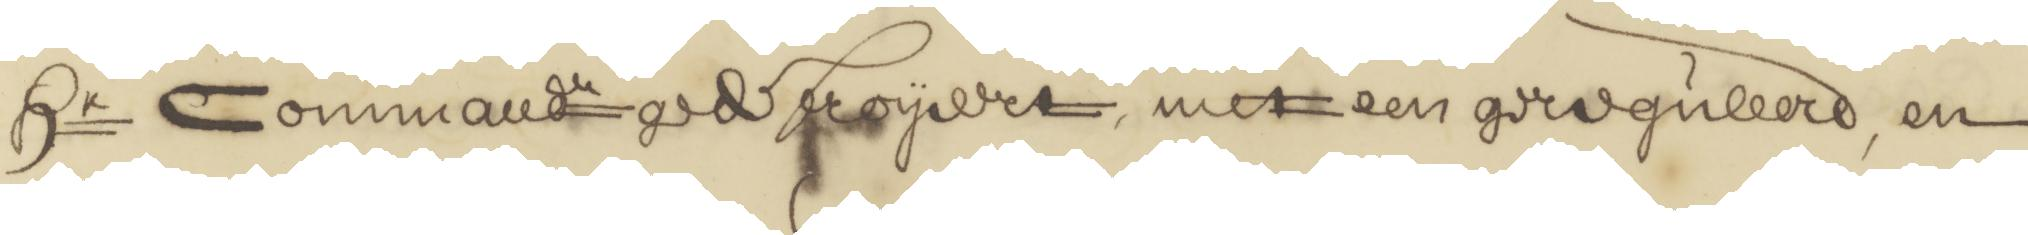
H=r Command=r gedefroijeert, met een gereguleerd, en
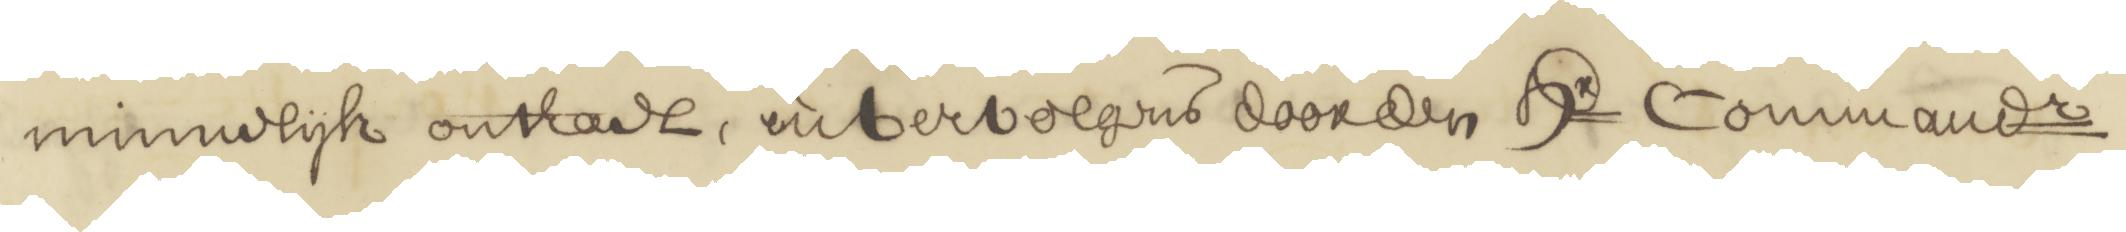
minnelijk onthael, en vervolgens door den H=r Command=r
